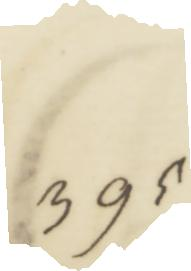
395
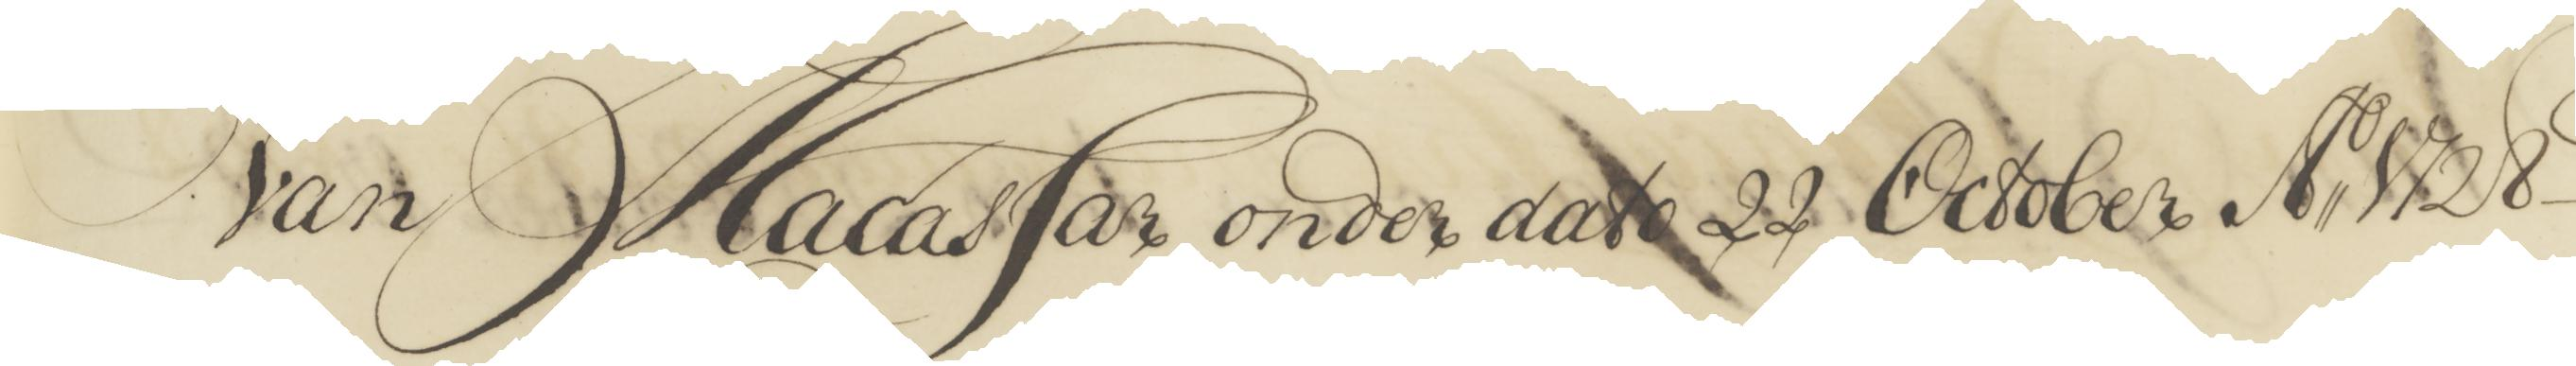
Van Macassar onder dato 22 October A„o 1728.
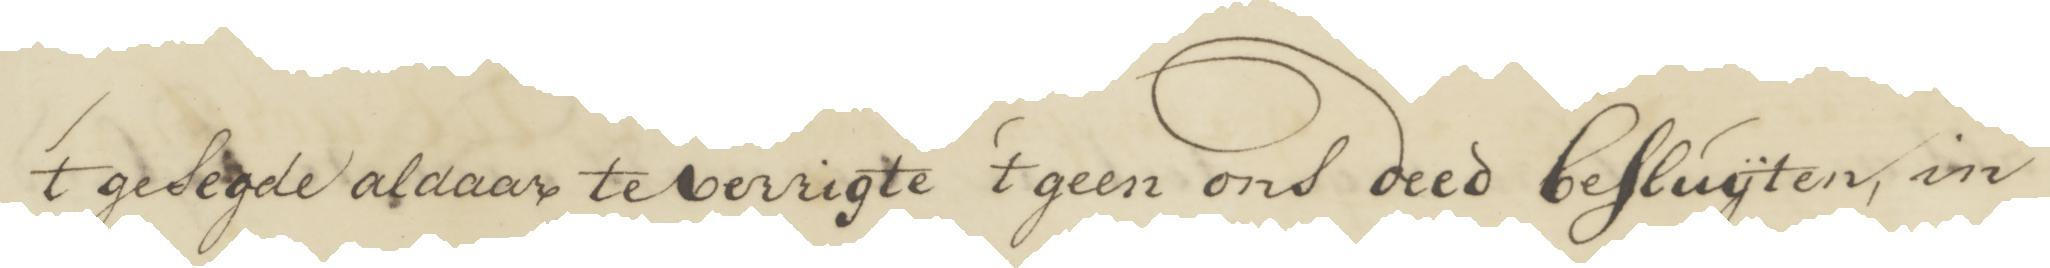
’t gesegde aldaar te verrigte ’t geen ons deed besluijten, in
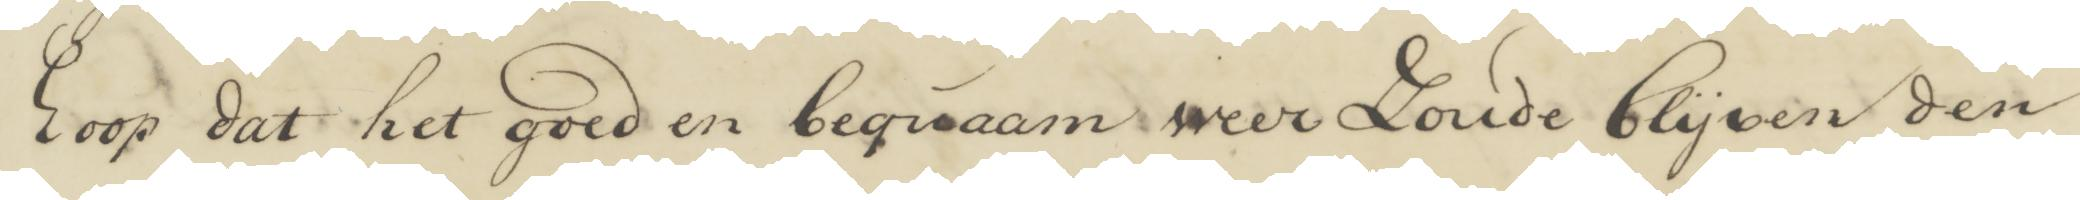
hoop dat het goed en bequaam weer zoude blijven den
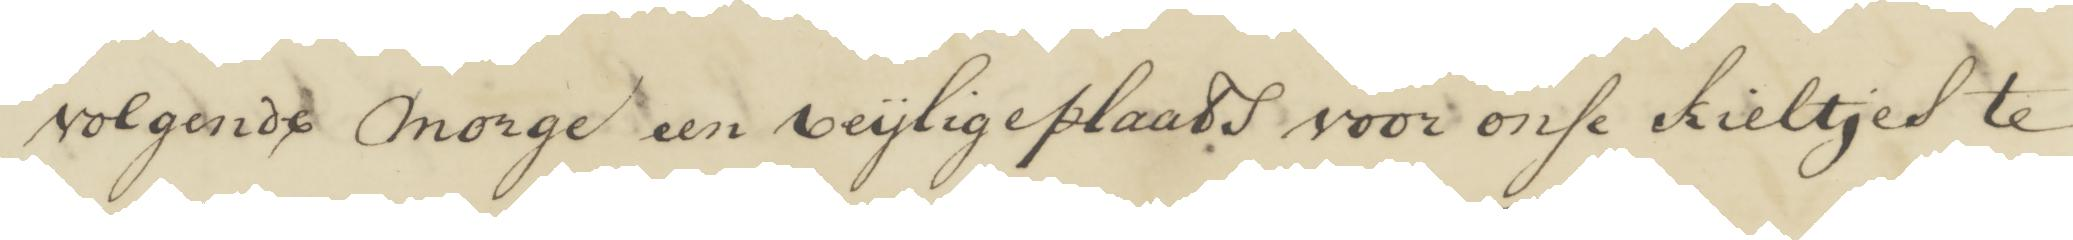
volgende morge een veijlige plaats voor onse kieltjes te
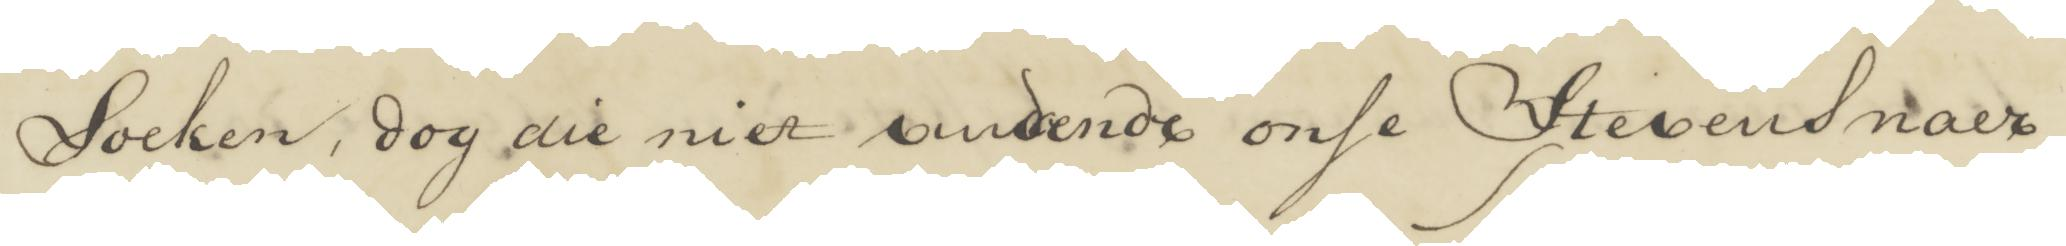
soeken, dog die niet vindende onse Stevens naer
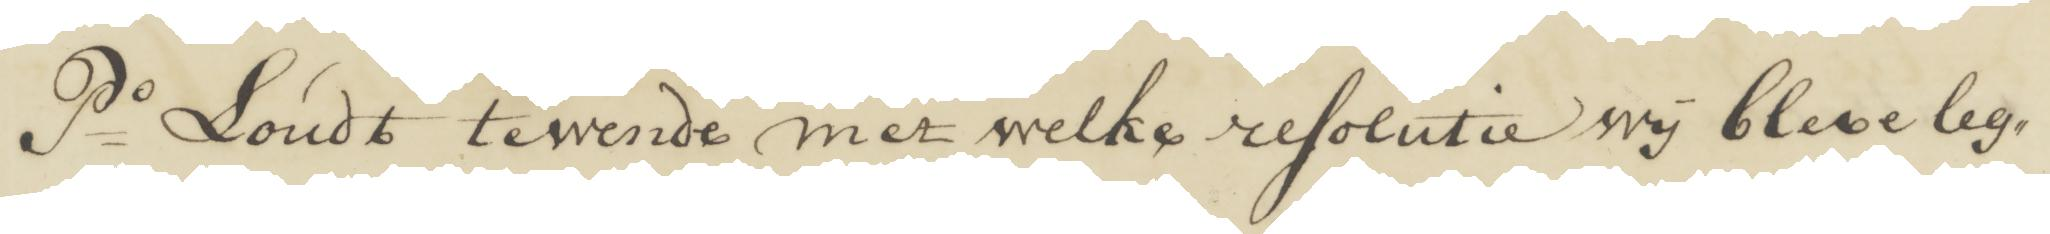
P=o Loudt tewende met welke resolutie wij bleve leg„
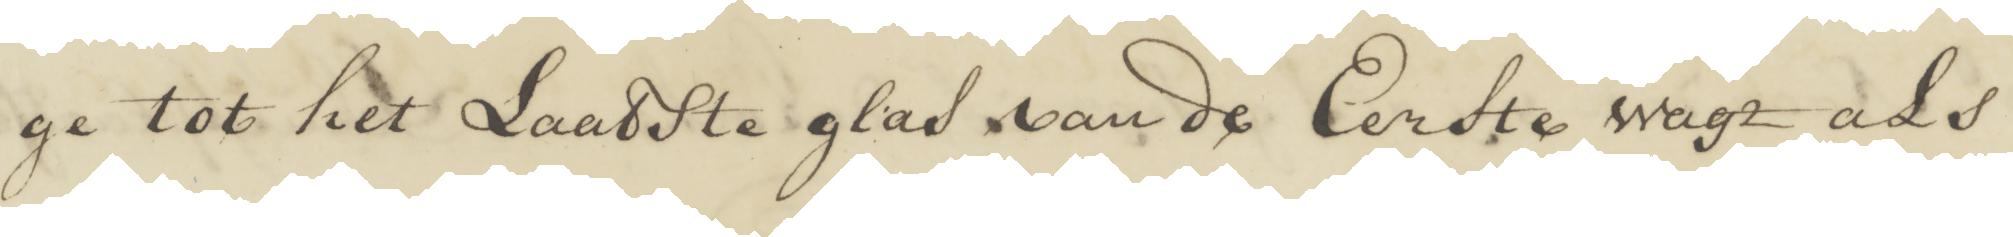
ge tot het Laatste glas van de Eerste wagt als
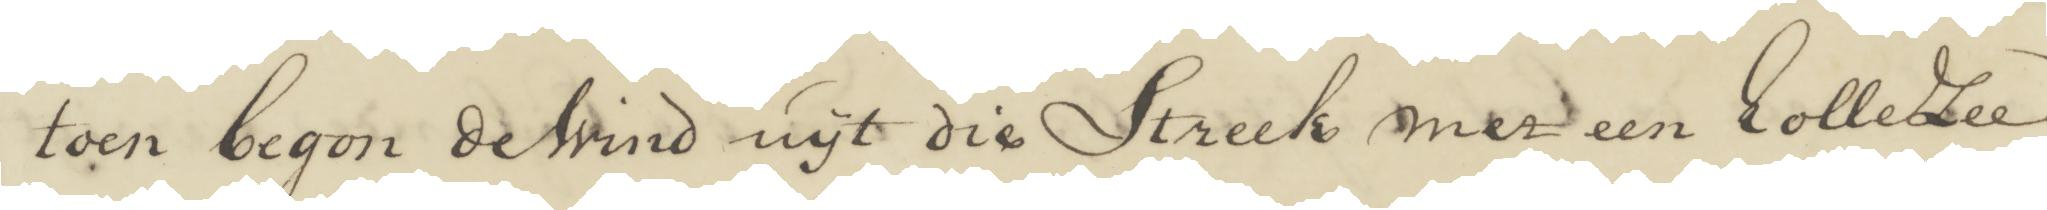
toen begon de wind uijt die Streek met een holle zee
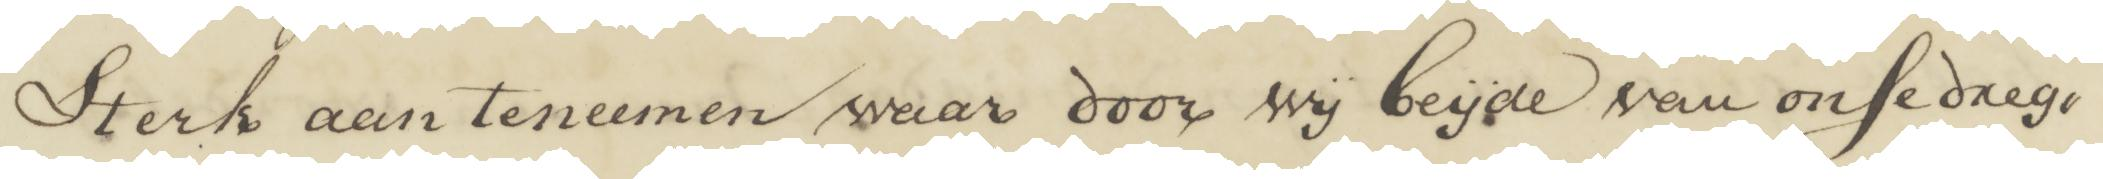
sterk aan teneemen waar door wij beijde van onse dreg„
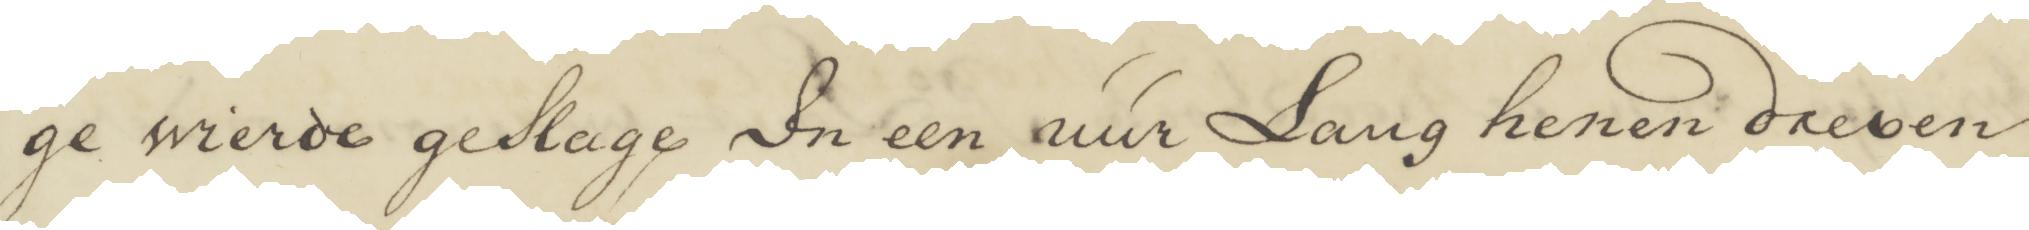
ge wierde geslage En een uur Lang henen dreven
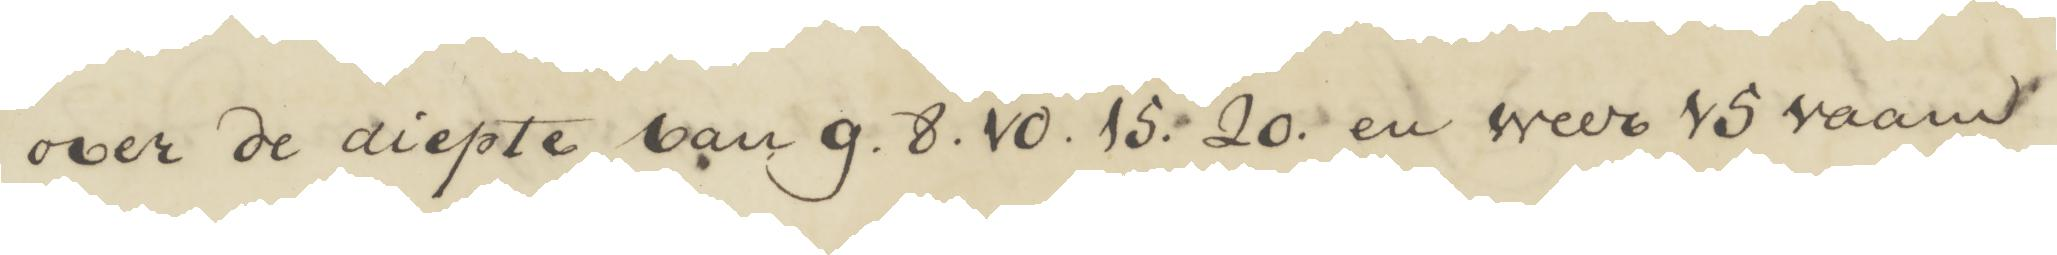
over de diepte van 9. 8. 10. 15. 20. en weer 15 vaam
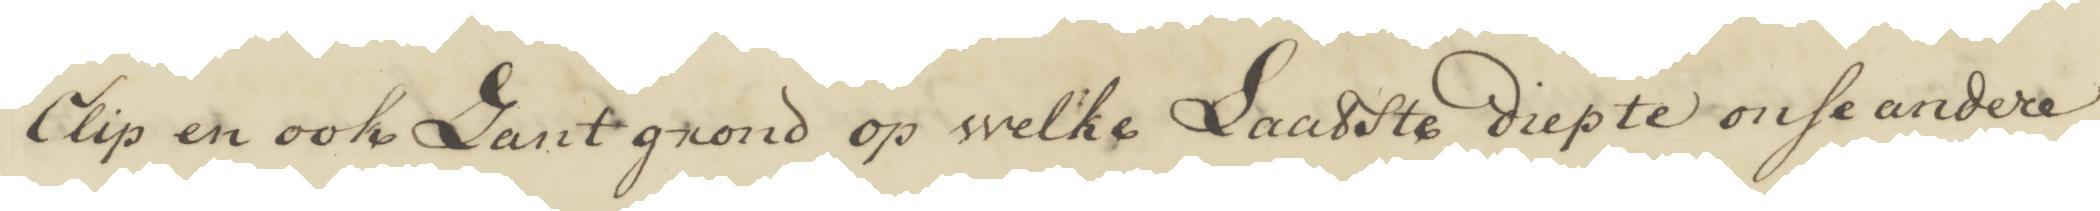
Clip en ook zant grond op welke Laatste diepte onse andere
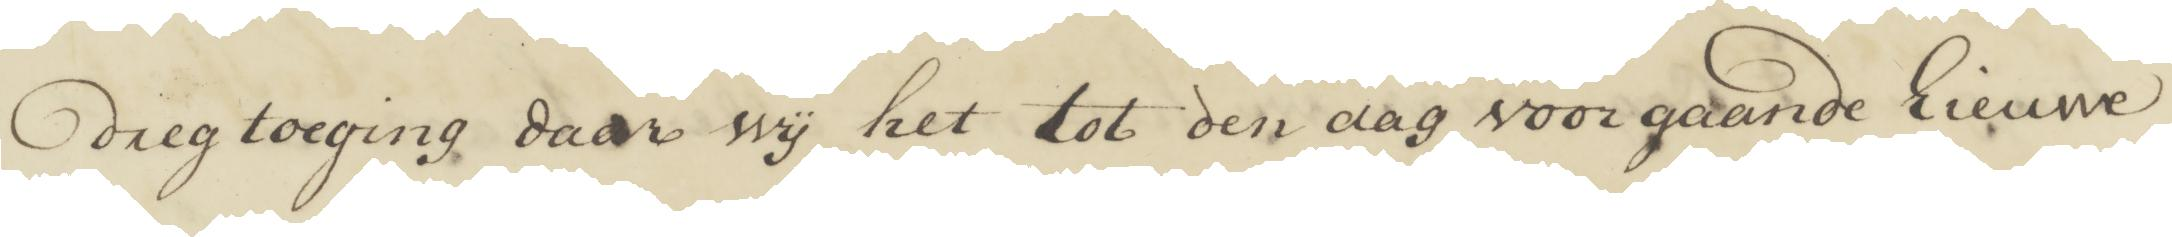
dreg toeging daar wij het tot den dag voorgaande hieuwe
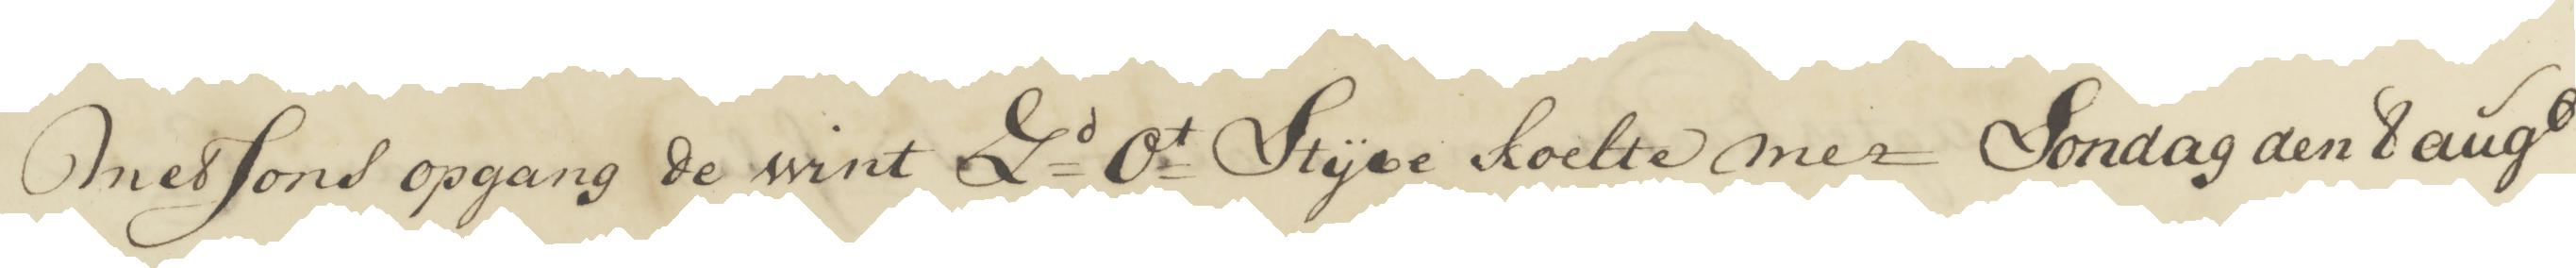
met sons opgang de wint Z=d O=t Stijve koelte met Sondag den 8 augs
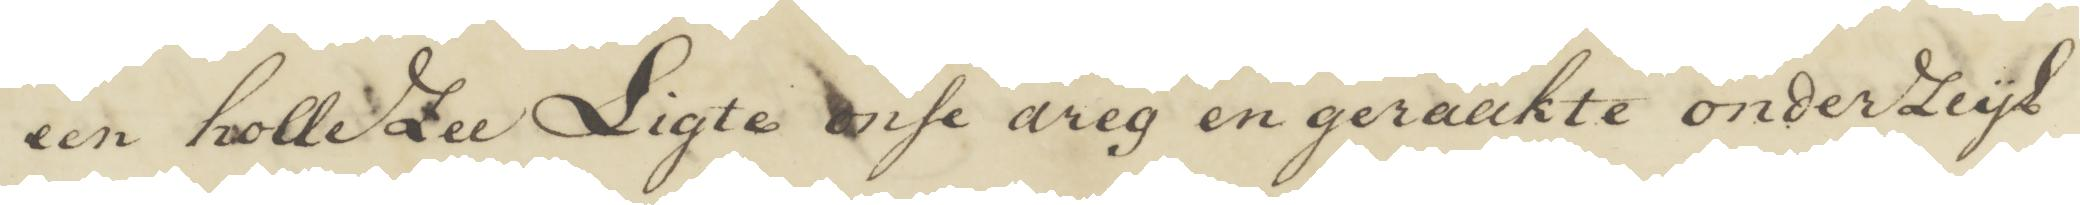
een holle zee Ligte onse dreg en geraakte onderzeijl
